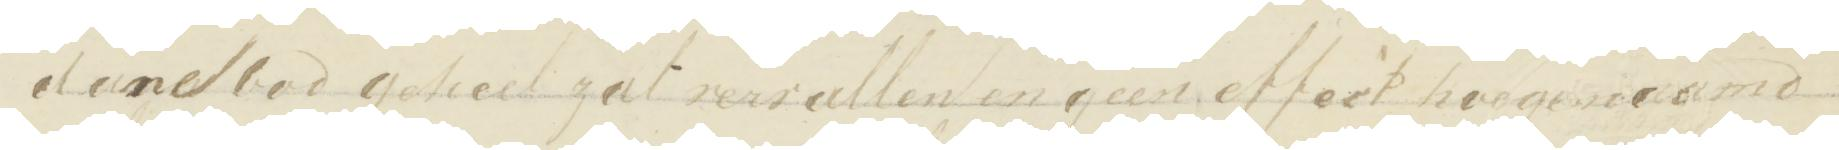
dane bod geheel zal vervallen en geen effect hoegenaamd
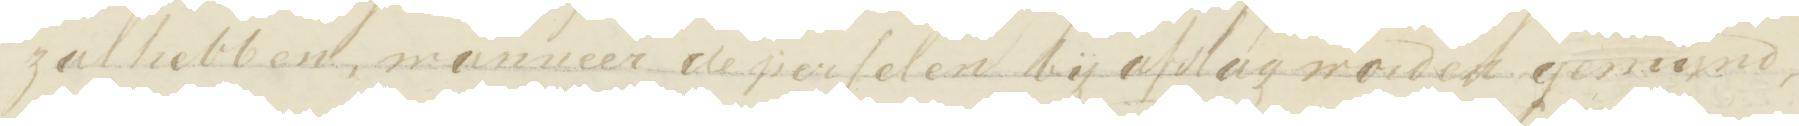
zal hebben, wanneer de percelen bij afslag worden gemynd,
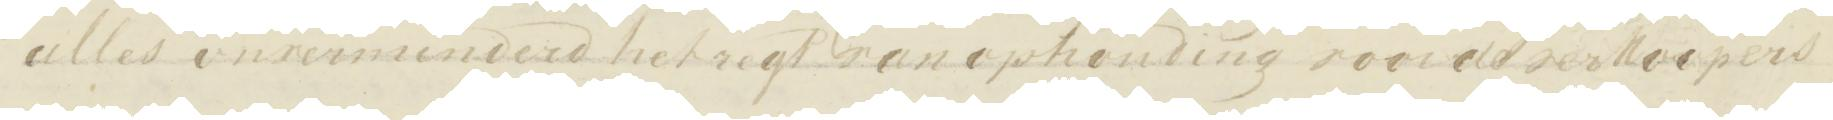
alles onverminderd het regt van ophouding voor de verkoopers
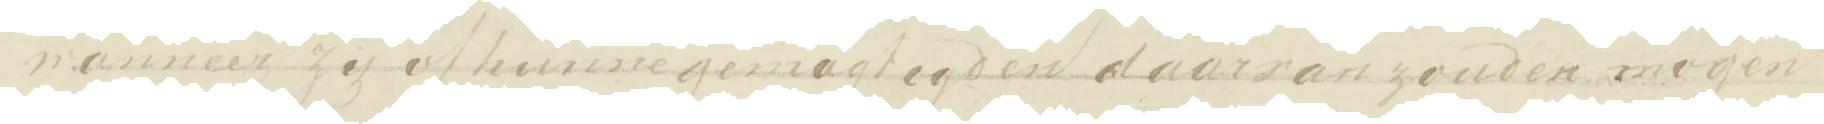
wanneer zij of hunne gemagtigden daarvan zouden mogen
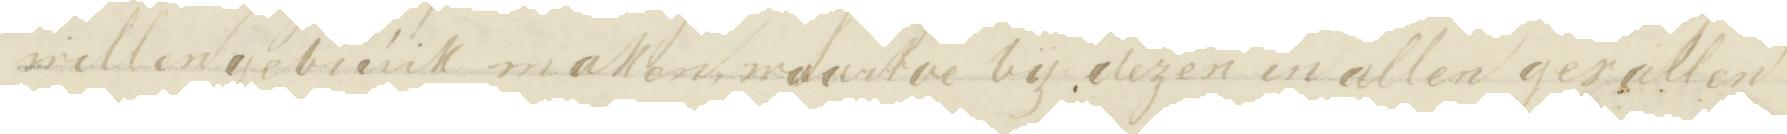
willen gebruik maken, waartoe bij dezen in allen gevallen
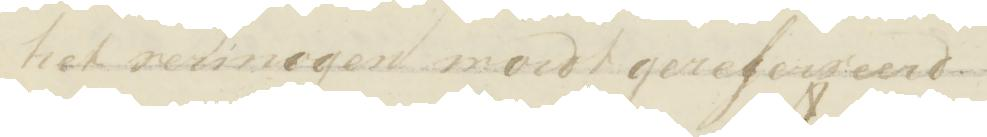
het vermogen wordt gereserveerd
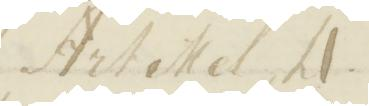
Artikel„ 4.
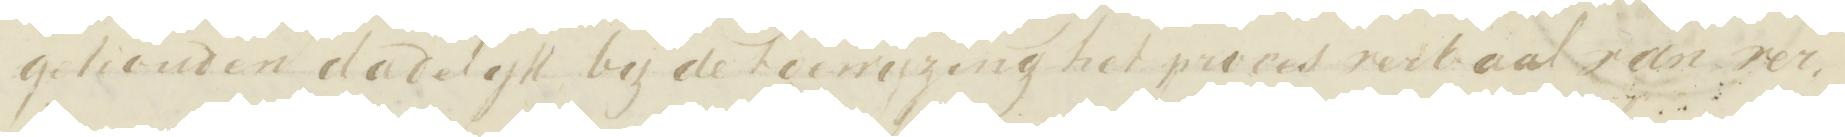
gehouden dadelyk by de toewyzing het proces verbaal van ver„
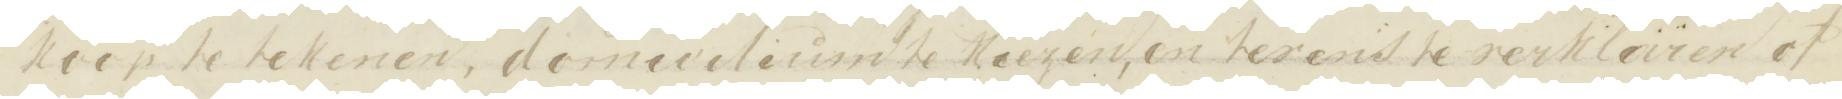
koop te tekenen, domiclium te kiezen en tevens te verklaren of
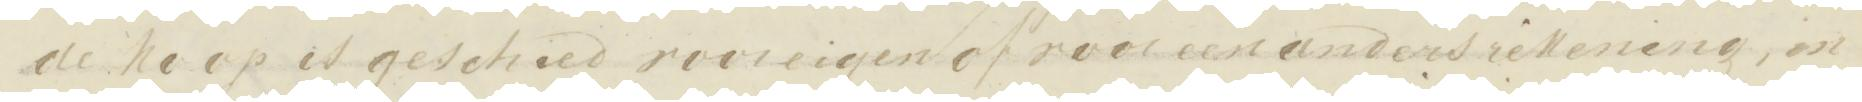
de koop is geschied voor eigen of voor een anders rekening, in
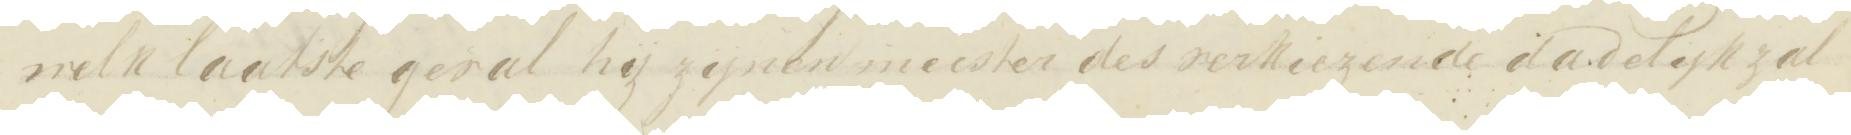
welk laatste geval hij zijnen meester des verkiezende dadelyk zal
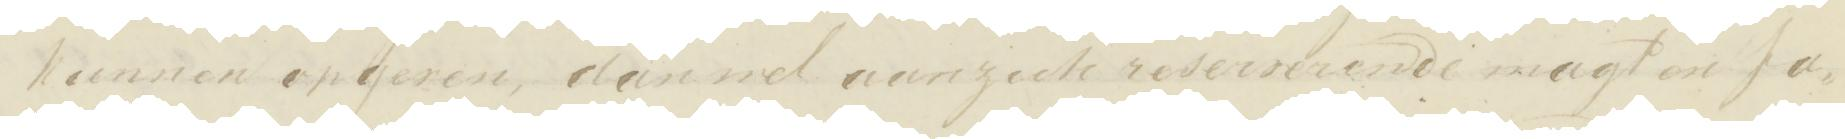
kunnen opgeven, dan wel aanzich reserverende magt en fa„
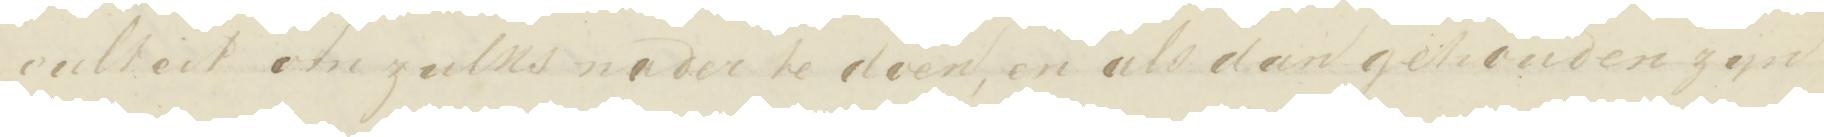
culteit om zulks nader te doen, en als dan gehouden zyn
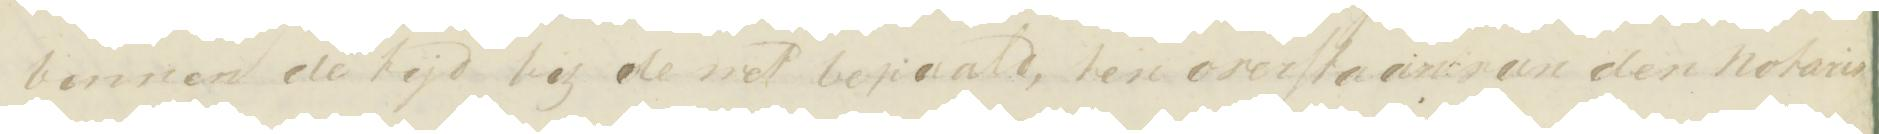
binnen de tijd bij de wet bepaald ten overstaan van den notaris
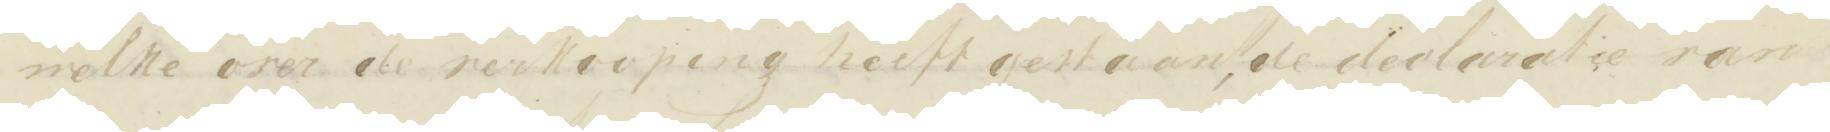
welke over de verkooping heeft gestaan, de declaratie van
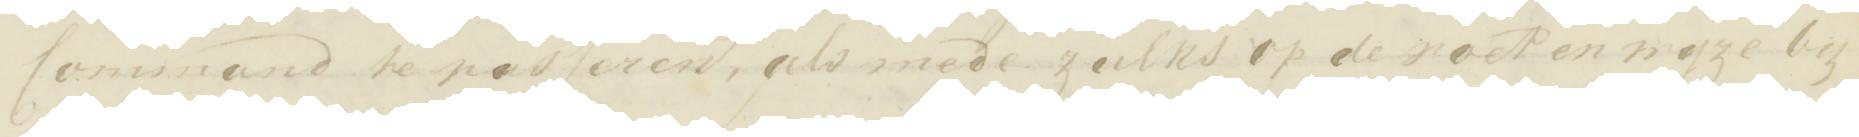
Command te passeren, als mede zulks op de voet en wyze by
